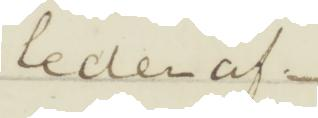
leden af.
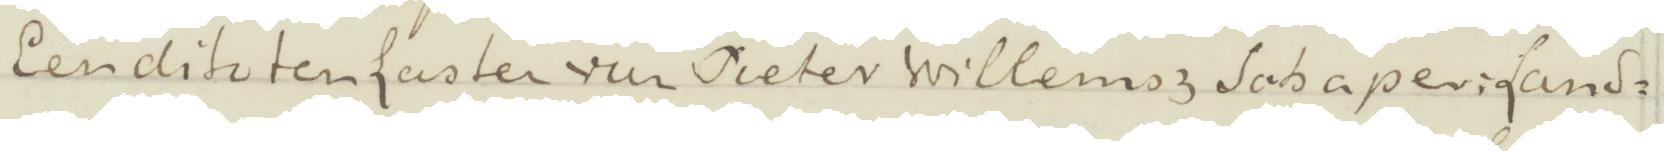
Een dito ten Lasten van Pieter Willem Schaper: Land=
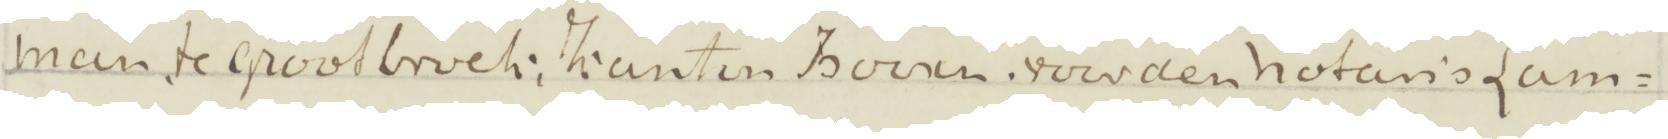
man, te Grootbroek, kanton hoorn, voor den notaris Lam=
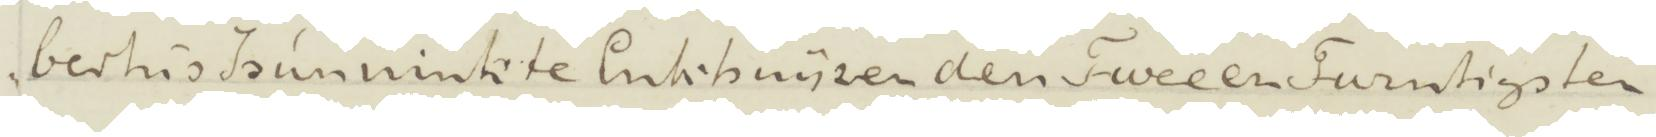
=bertus hunnink te Enkhuizen den Twee en Twintigsten
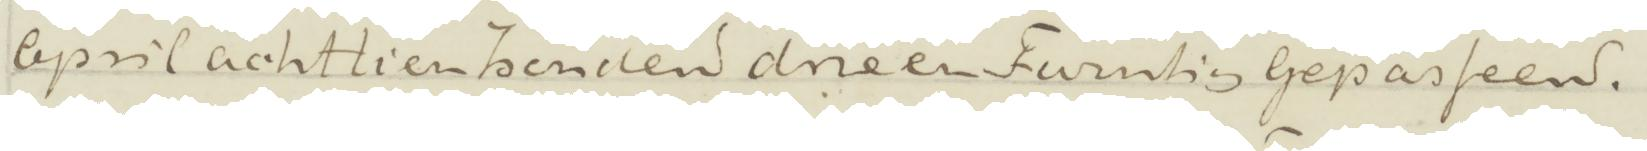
April achttien honderd drie en Twintig Gepasseerd.
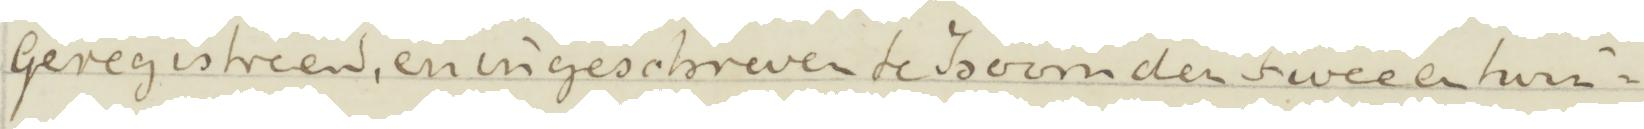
Gerigisteerd, en ingeschreven te hoorn den Twee en twin=
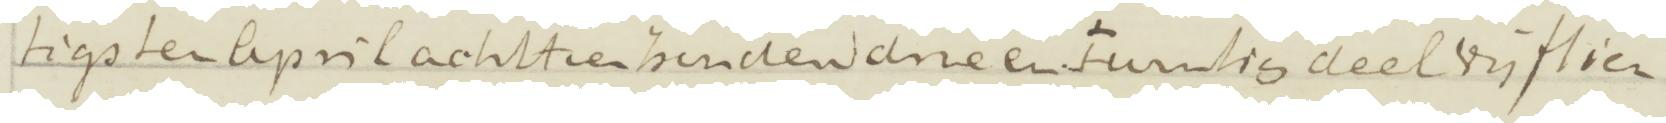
tigsten April achttien honderd drie en twintig deel vijftien
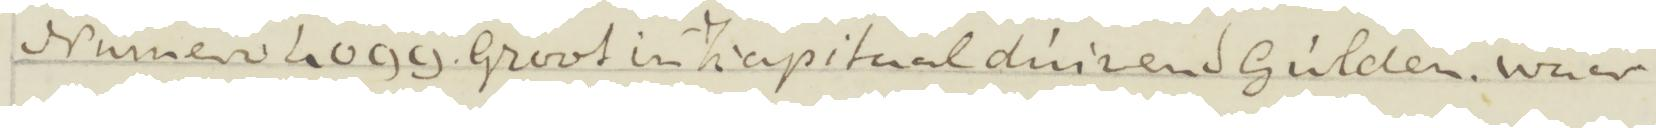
Numero 4099. Groot in kapitaal duizend Gulden waar
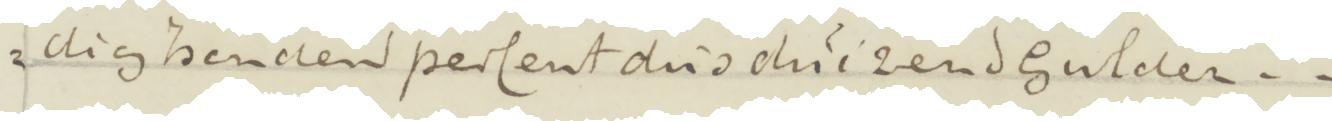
=dig honderd percent dus duizend Gulden - - - - - - - „ 1000 „ —
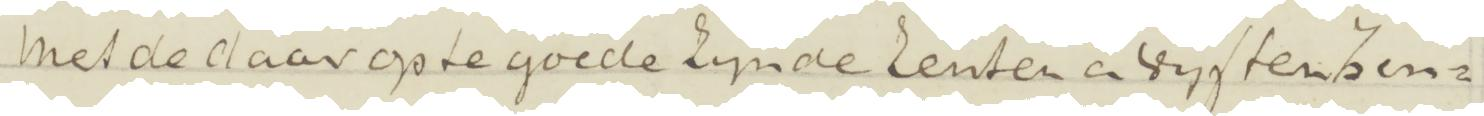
met de daar op te goede zynde renten a vijften hon=
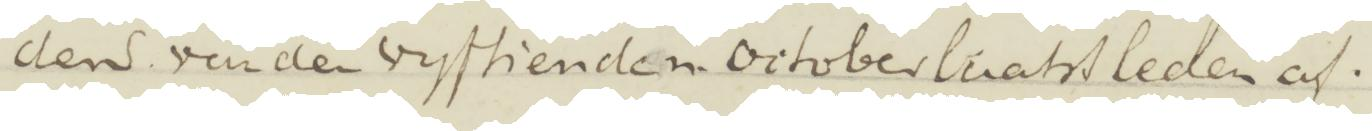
derd van den vyftienden october laatstleden af.
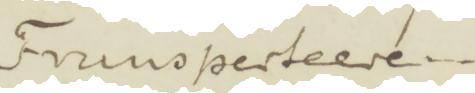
Transporteere . . . .
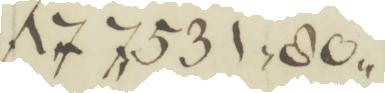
ƒ1,7 7,531 „80„
